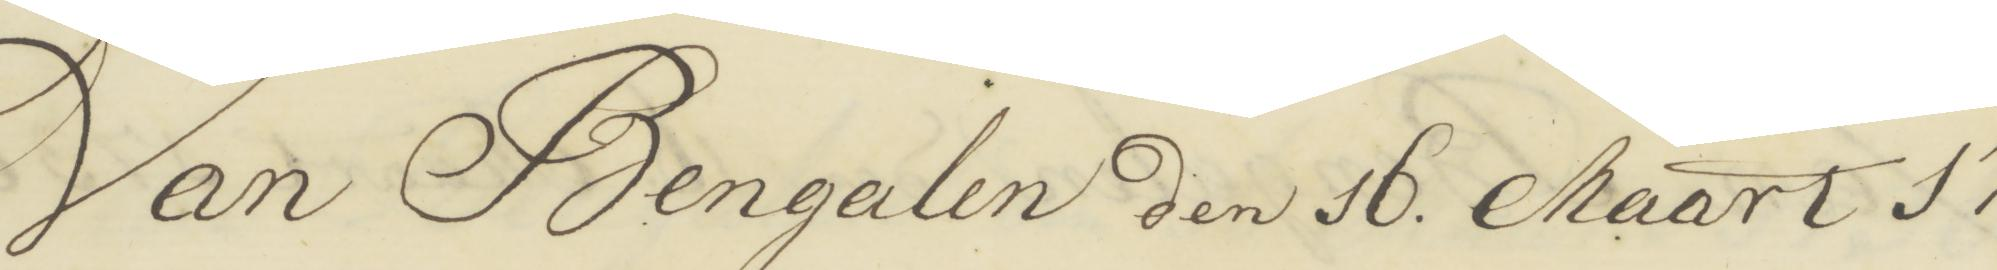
Van Bengalen den 16. Maart 17
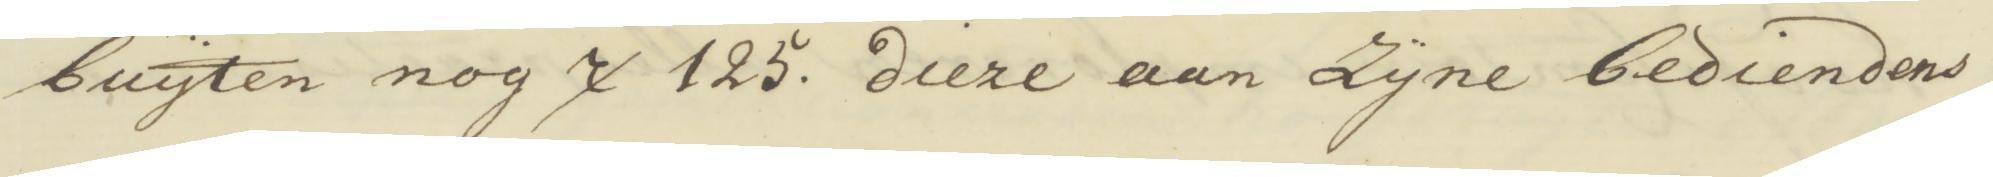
buijten nog r/ 125. dieze aan zijne bediendens
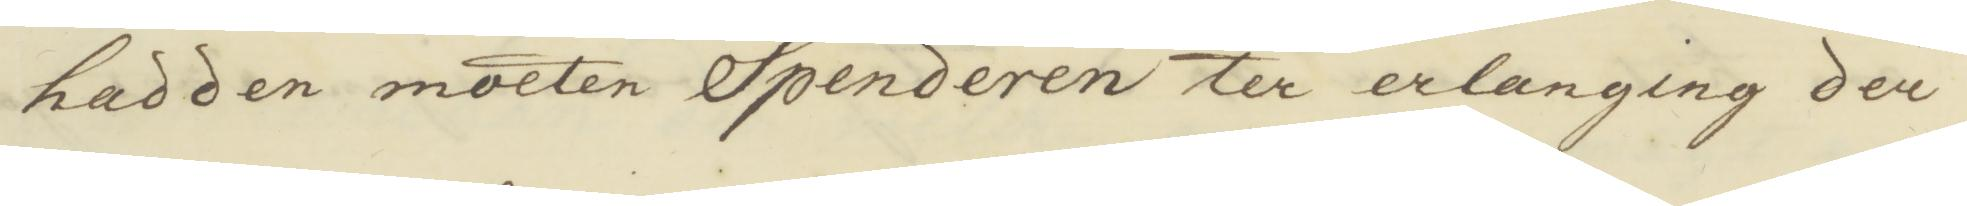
hadden moeten Spenderen ter erlanging der
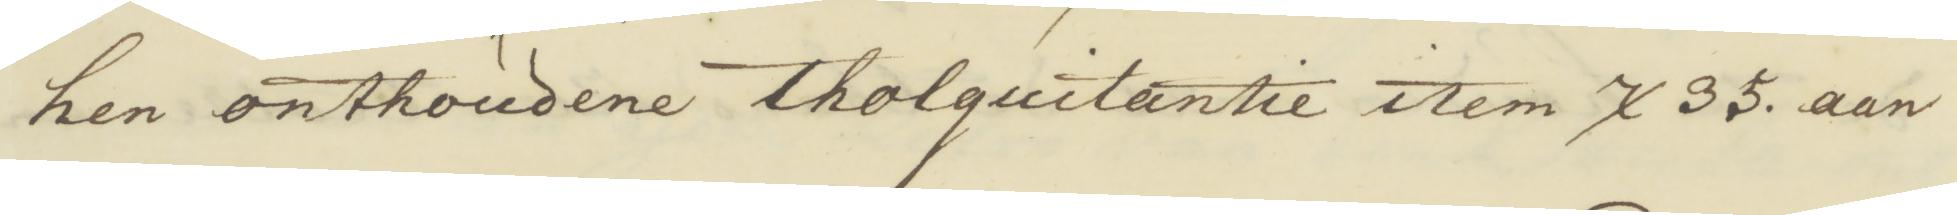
hen onthoudene thol quitantie item r 35. aan
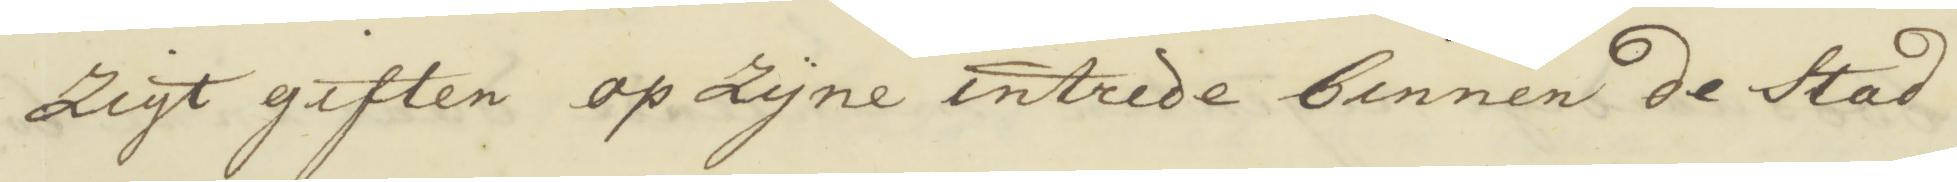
Zigt giften op zijne intrede binnen de Stad
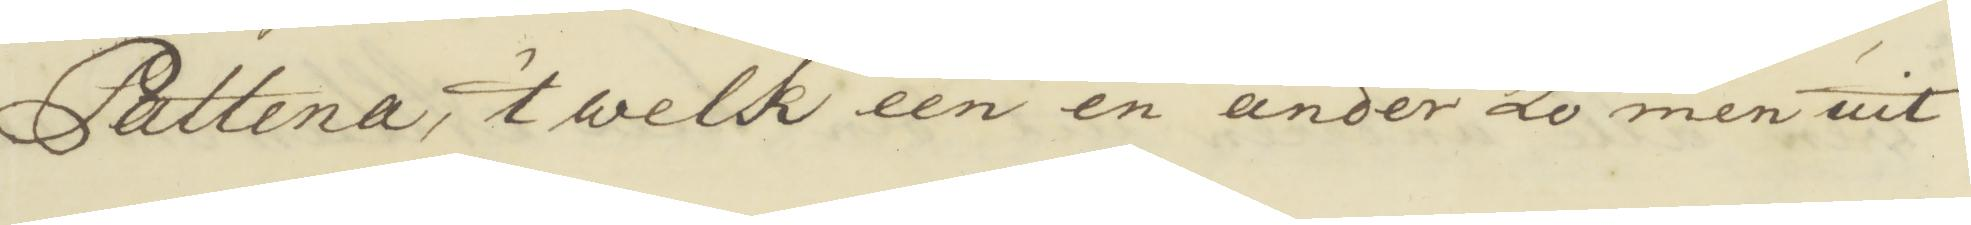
Pattena, 't welk een en ander zo men uit
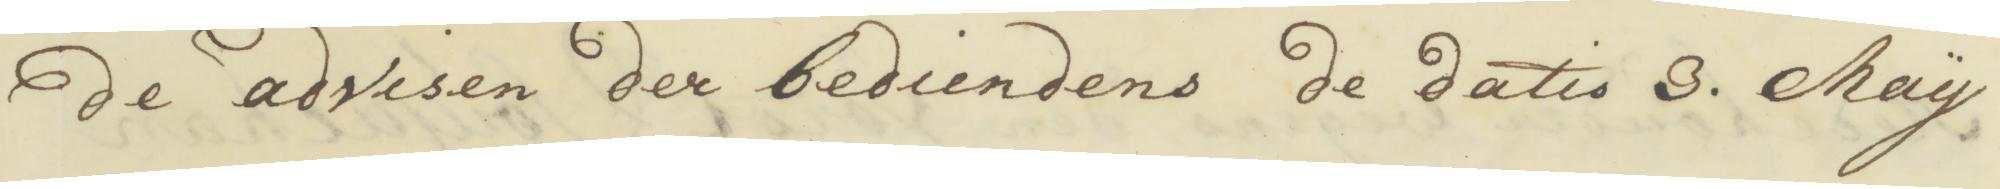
de advisen der bediendens de datis 3. Maij
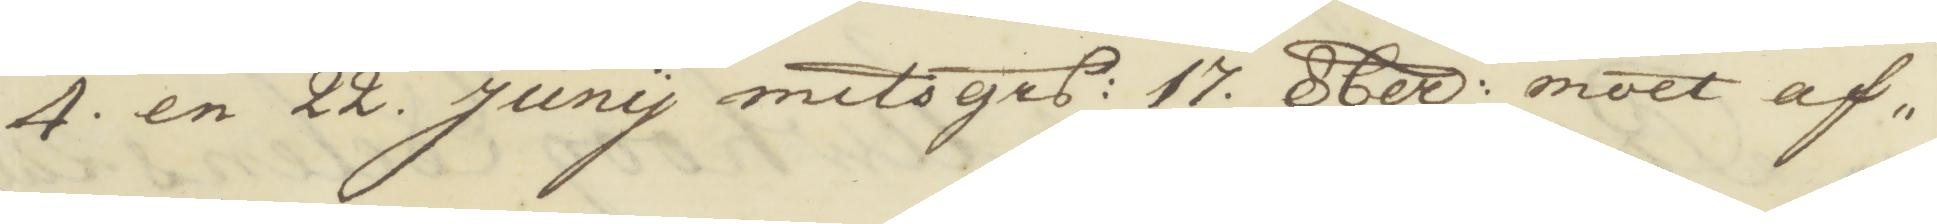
4. en 22. Junij mitsgrs: 17. 8ber: moet af„
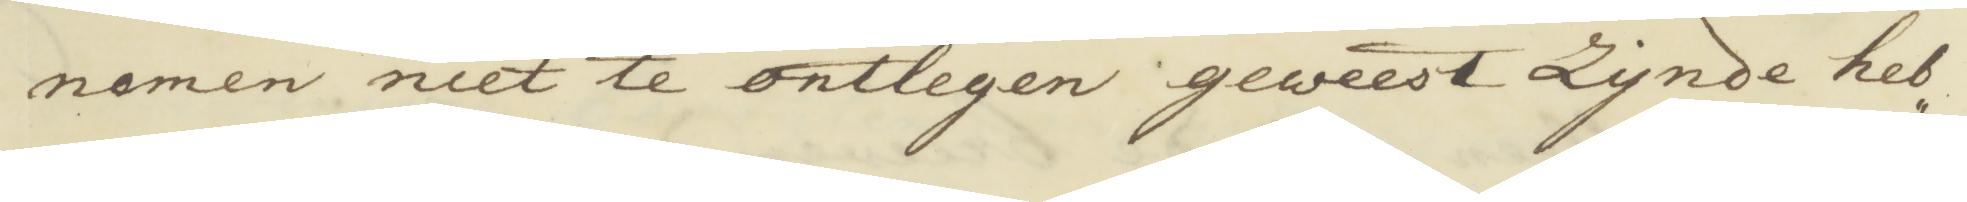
nemen niet te ontlegen geweest Zijnde heb„
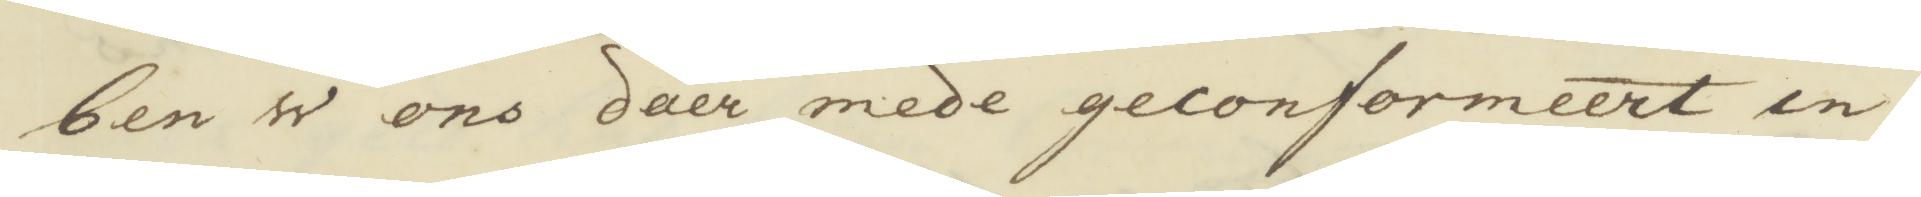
ben w ons daer mede geconformeert in
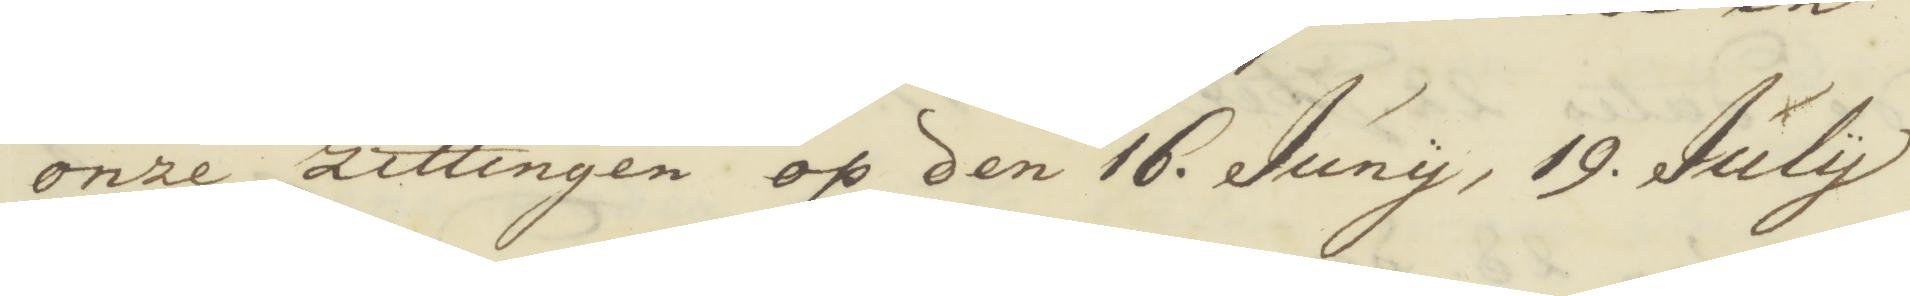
onze zittingen op den 16. Iunij, 19. Iulij
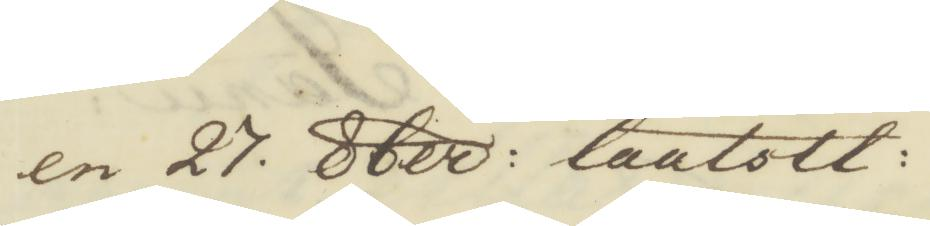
en 27. 8ber: laatstl:
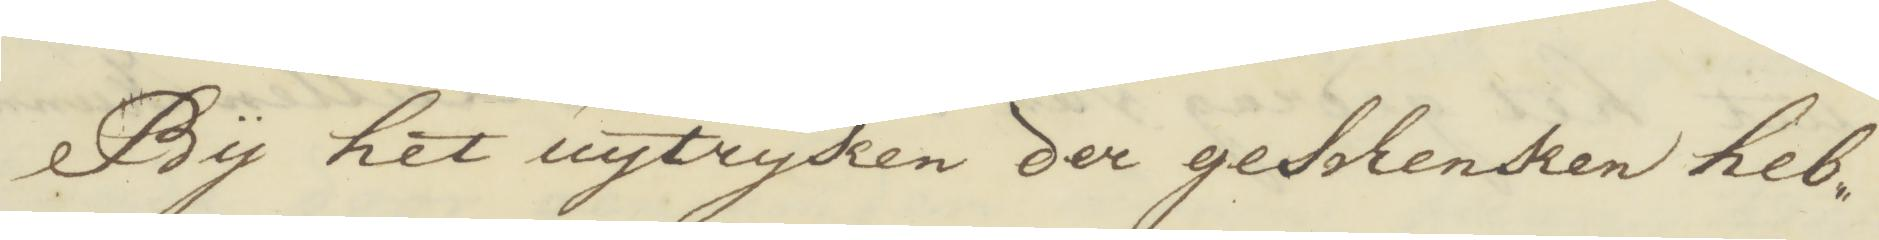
Bij het uijtrijken der geschenken heb„
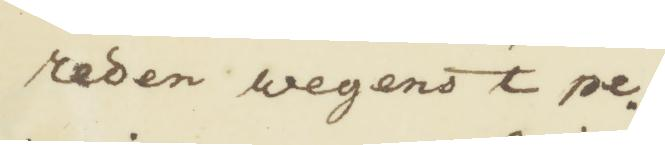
reden wegens ’t pe„
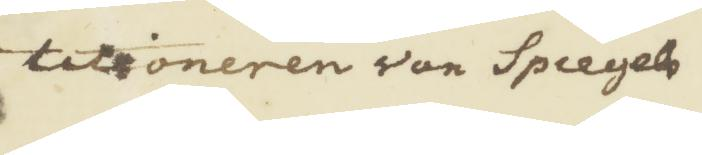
titioneren van Spiegels
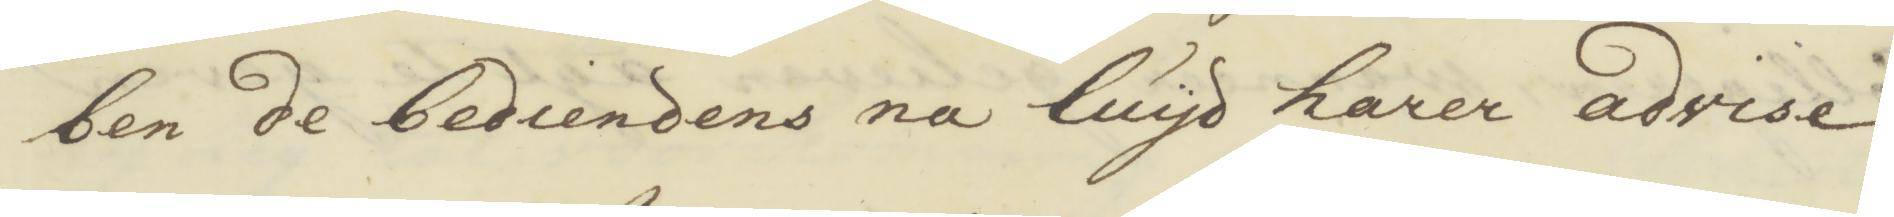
ben de bediendens na luijd harer advise
